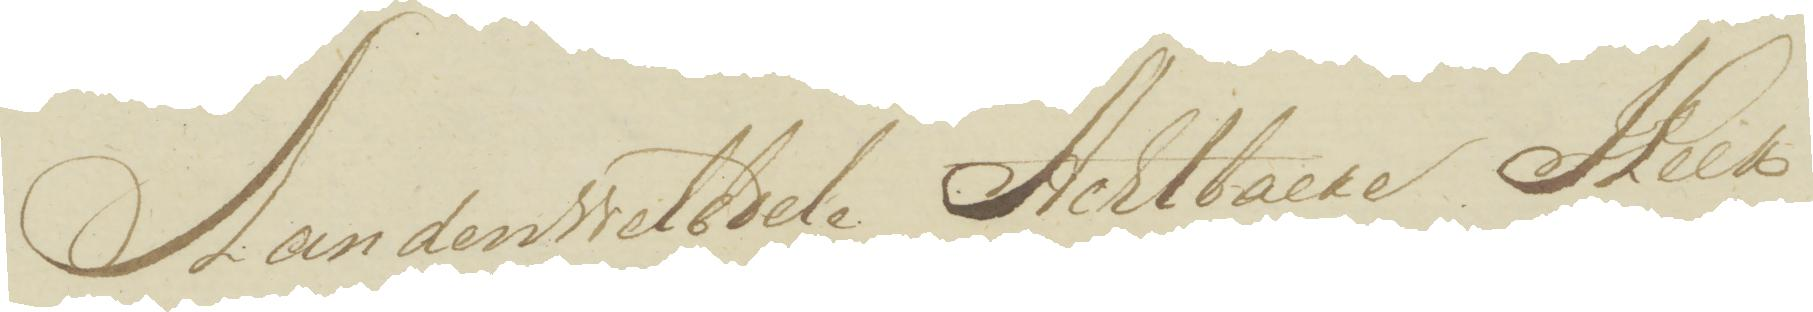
Aan den WelEdele Achtbaere Heer
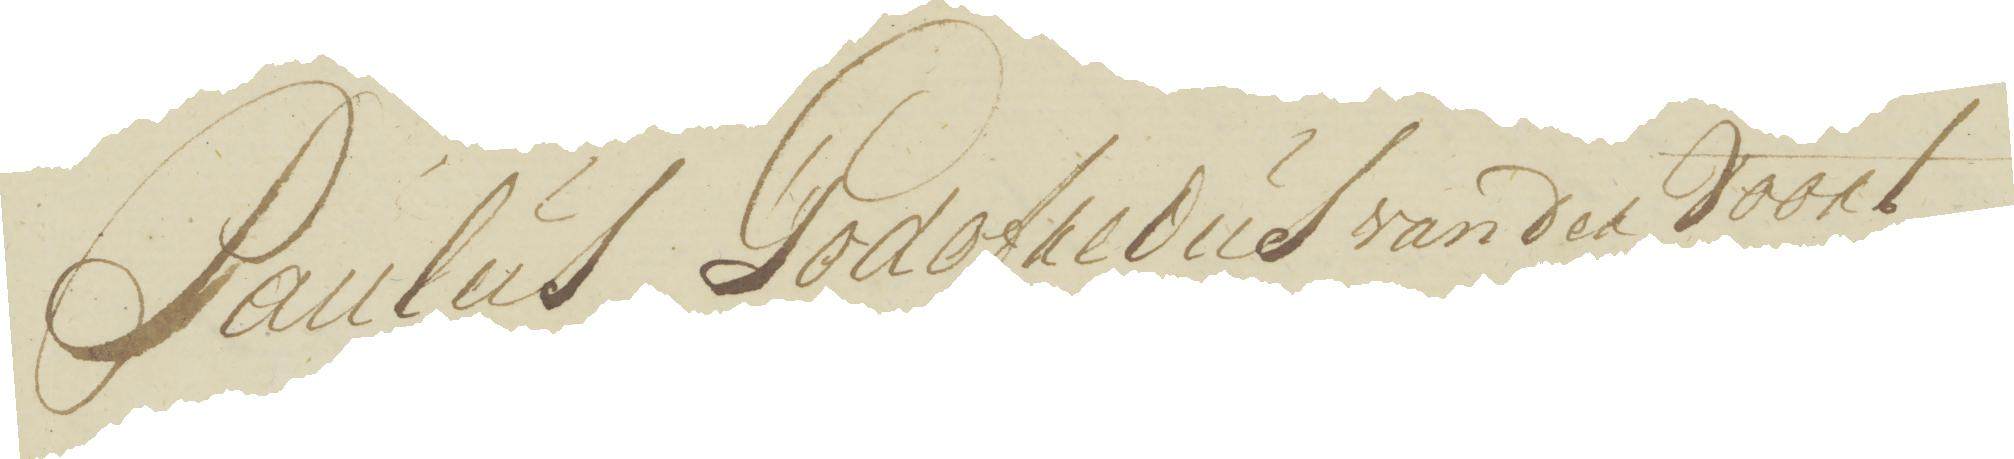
Paulus Godofredus van der Voort
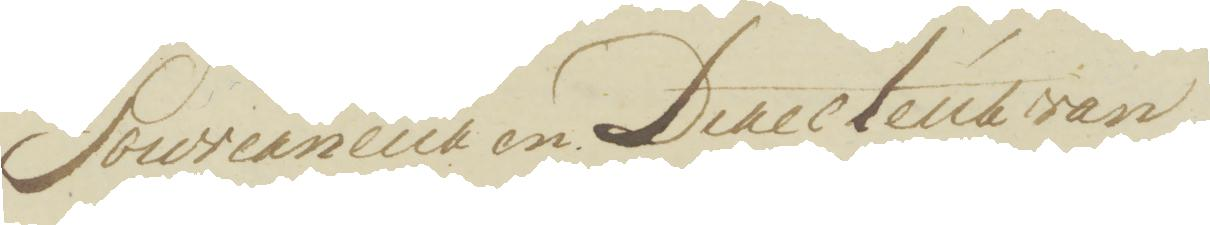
Gouverneur en Directeur van
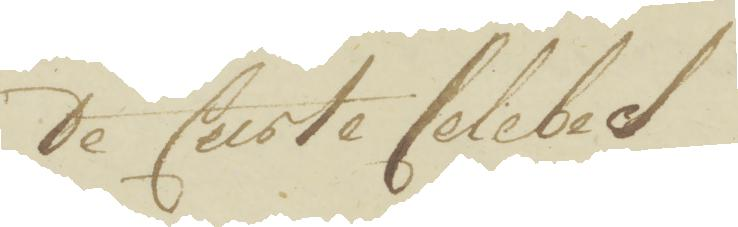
de Custe Celebes
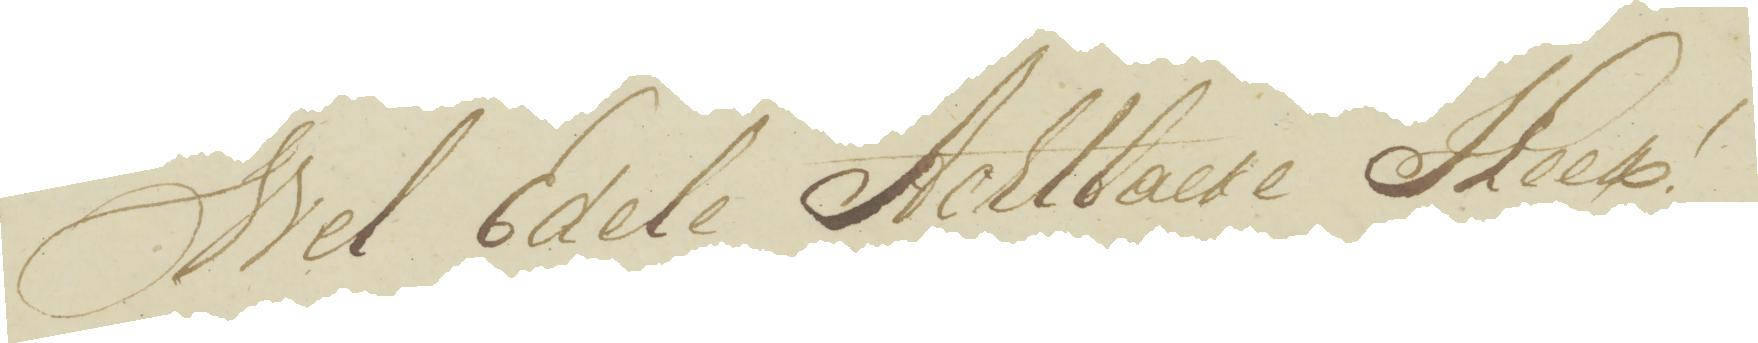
Wel Edele Achtbaere Heer!
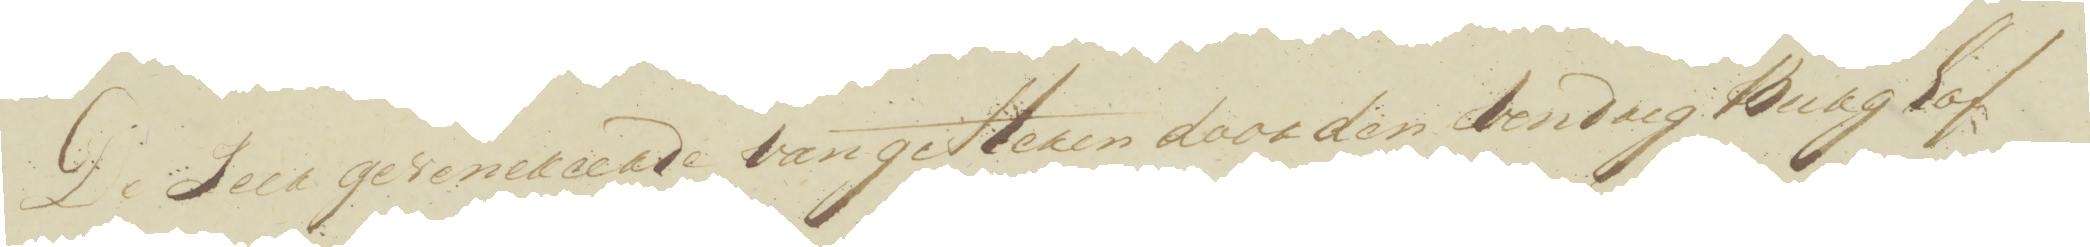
De seer gevenereerde van gisteren door den vendrig Burghof
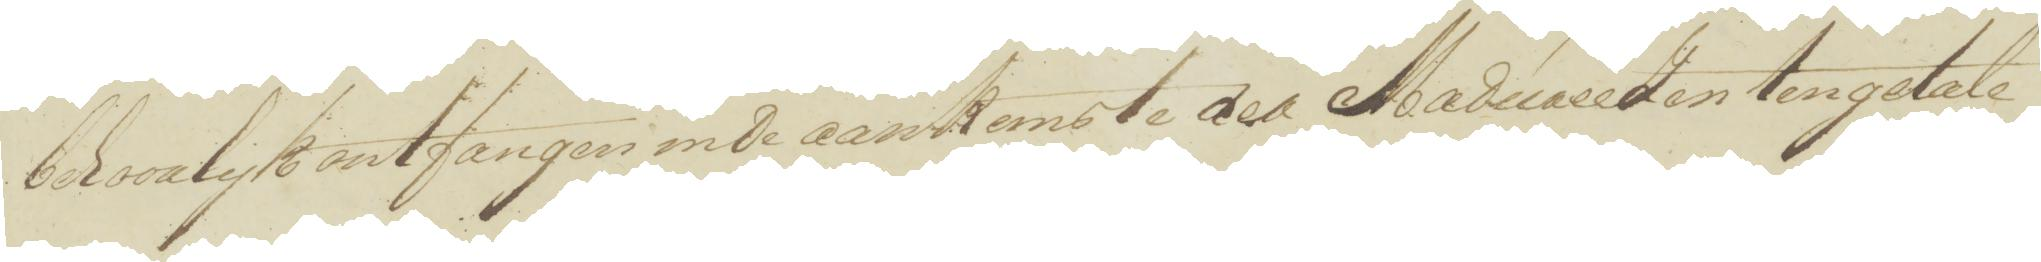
behoorlijk ontfangen inde aankomste der Madureesen ten getale
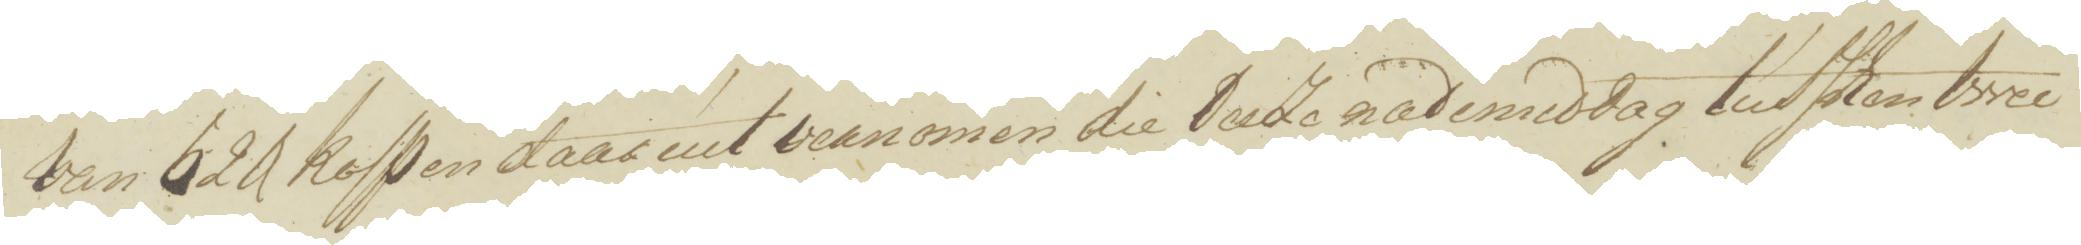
van 624 koppen daar uit vernomen die deeze nademiddag tusschen twee
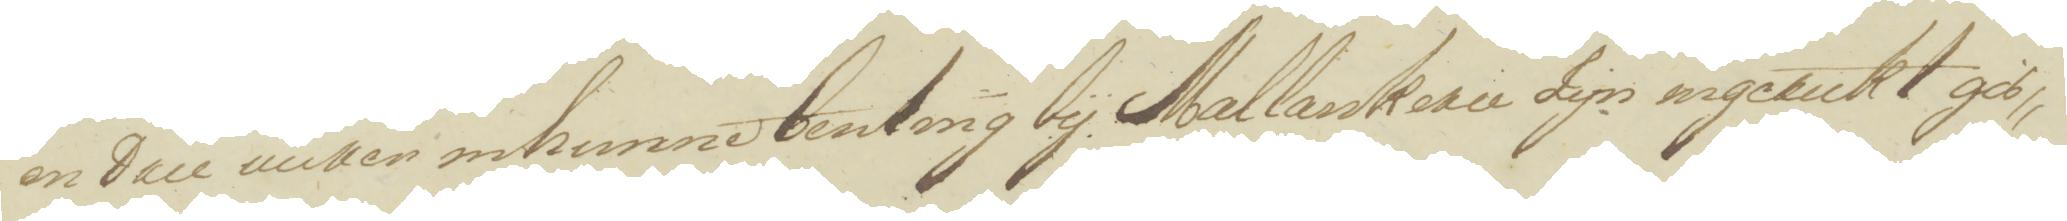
en drie uuren in hunne benting bij Mallankerie sijn ingerukt gis„
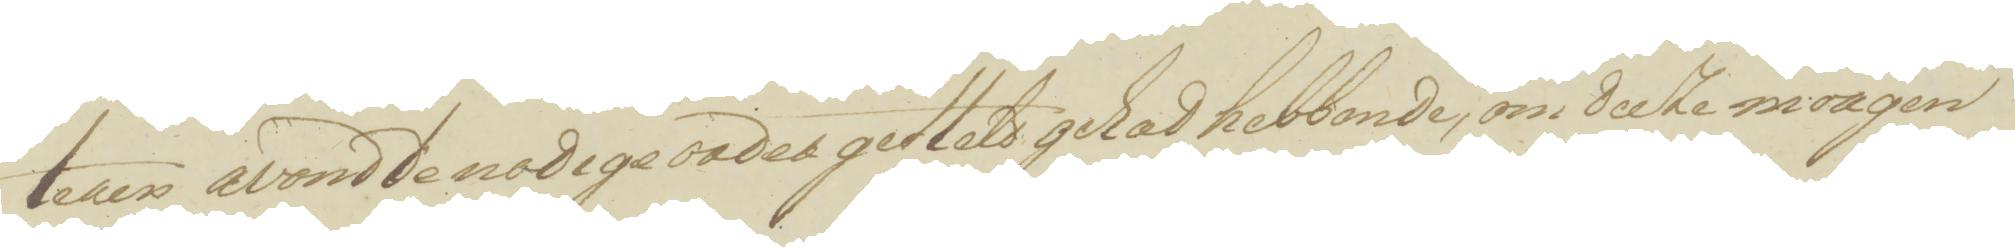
teren avond de nodige order gesteld gehad hebbende, om deeze morgen
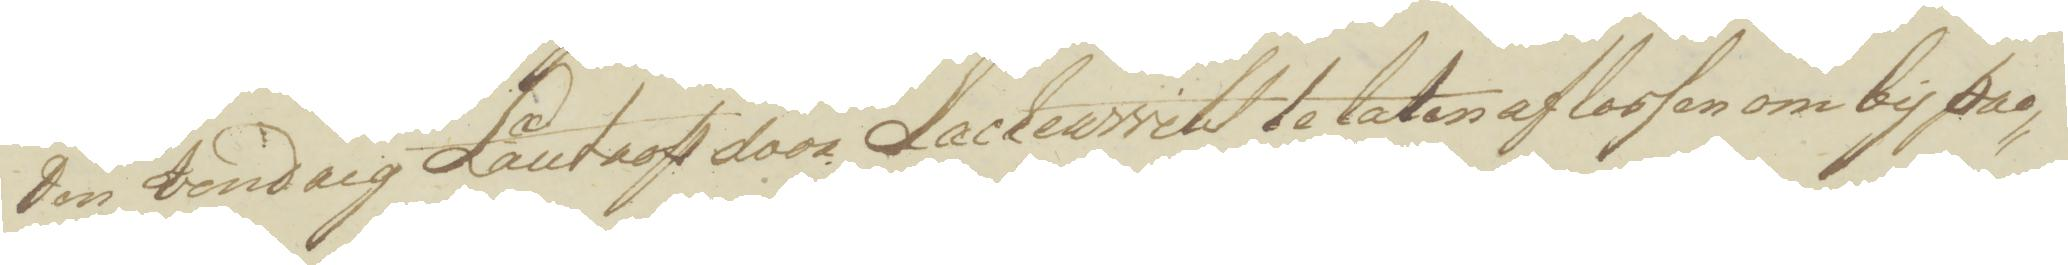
den vendrig Lantrop door Lacherwits te laten aflossen om bij pro„
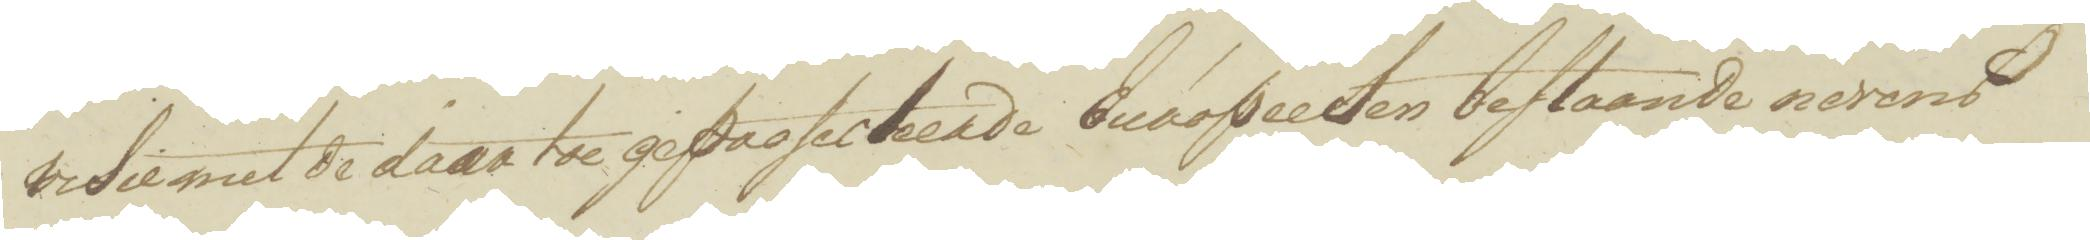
visie met de daar toe geprofecteerde Europeesen bestaande nevens
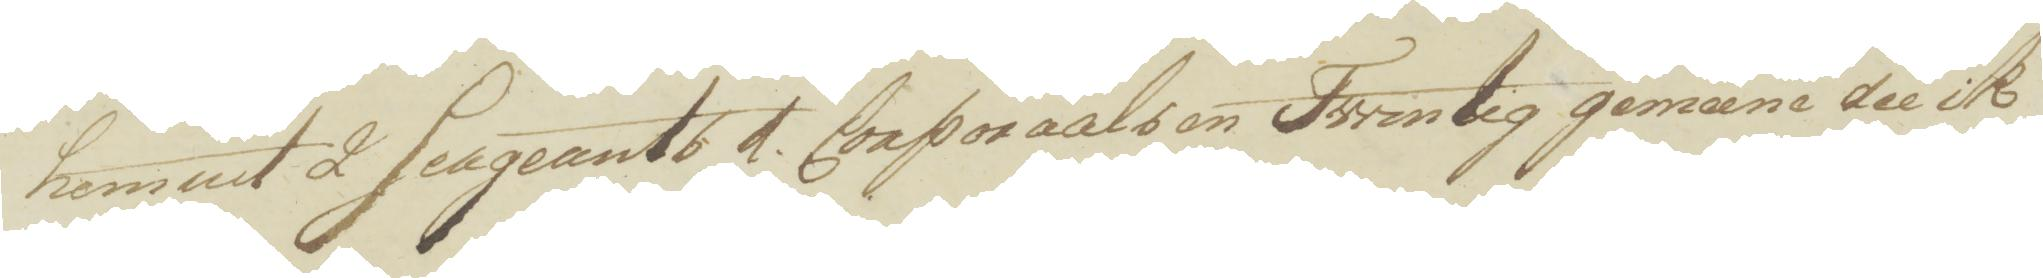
hem uit 2 sergeants 4. Corporaals en Twintig gemeene die ik
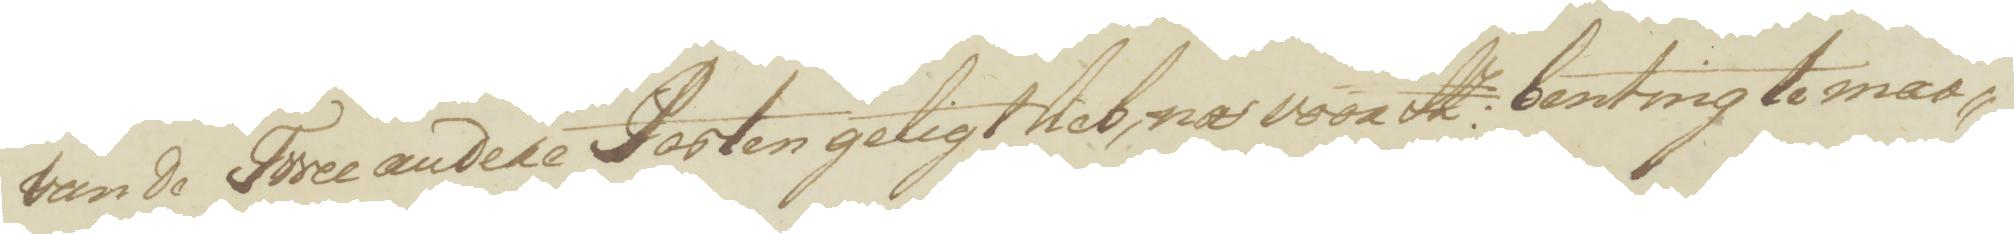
van de Twee andere Posten geligt heb, na voorsz: benting te mar„
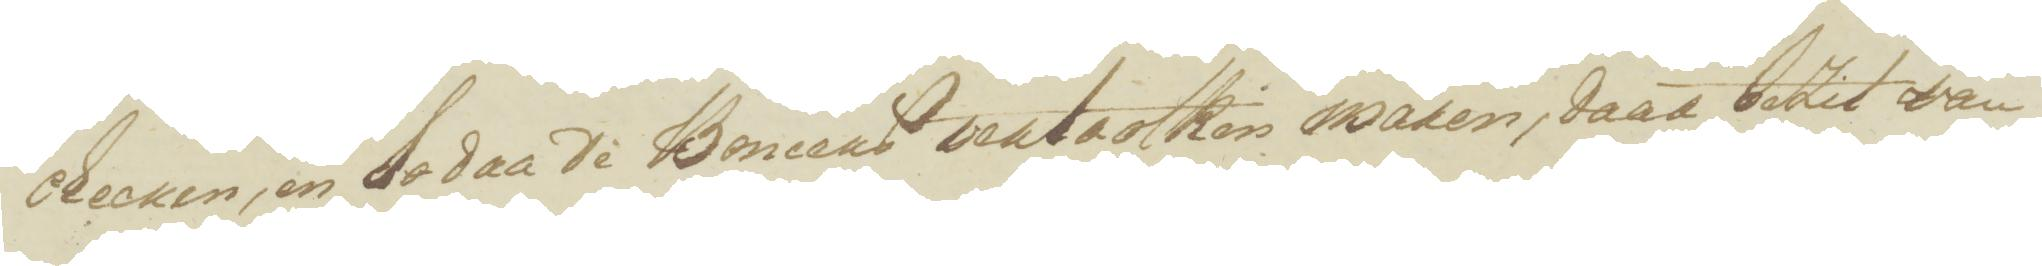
cheeren, en sodra de Boniers vertrocken waren, daar bezit van
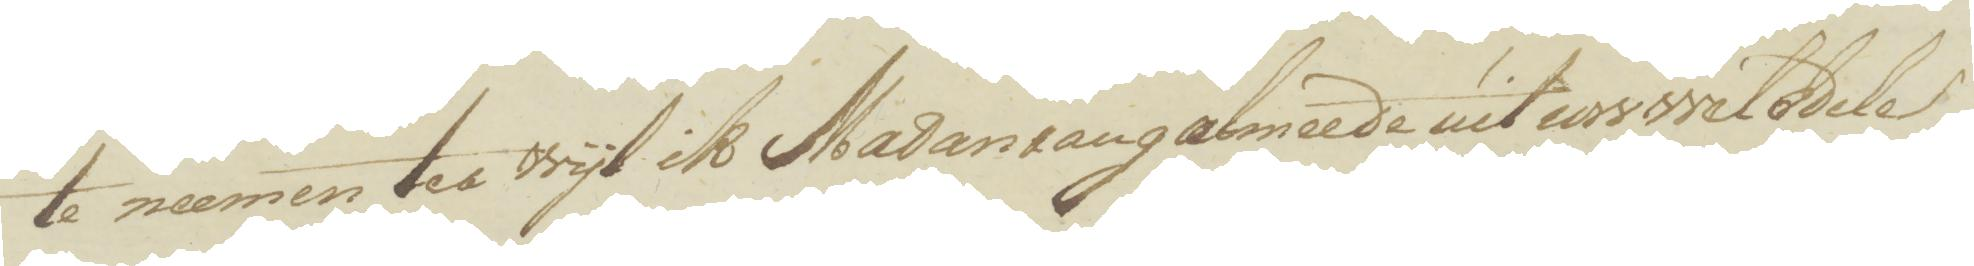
te neemen ter wijl ik Madanrang almeede uit uw wel Edele
